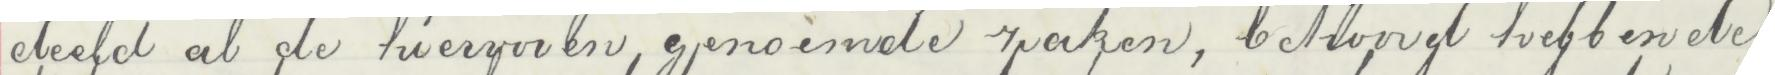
deeld al de hiervoren genoemde zaken, behoord hebbende
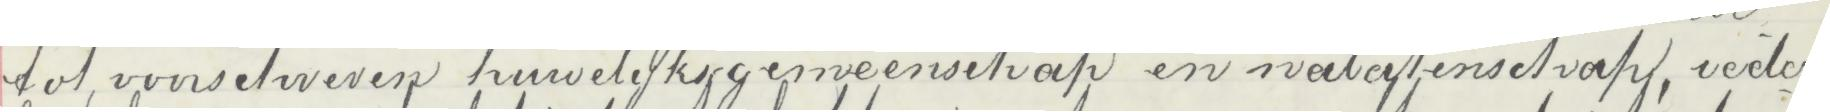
tot voorschreven huwelyksgemeenschap en nalatenschap, ieder
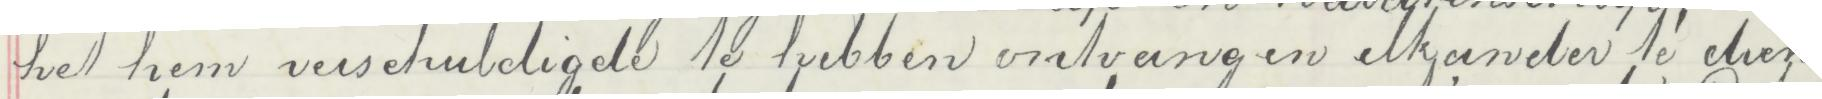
het hem verschuldigde te hebben ontvangen elk ander te dien
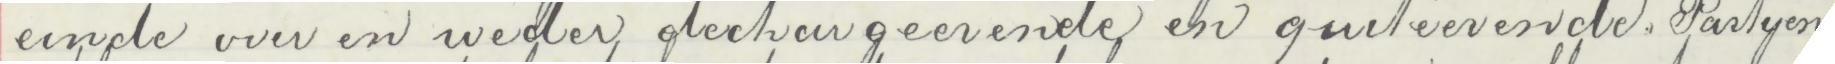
einde over en weder dechargeerende en quiteerende: Partyen
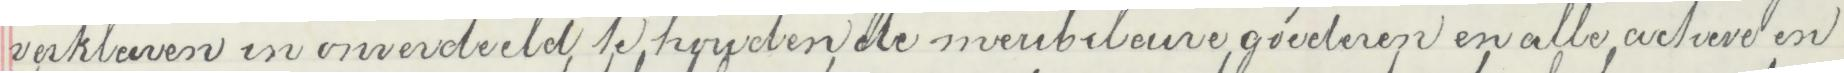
verklaren in onverdeeld te houden de meubilaire goederen en alle actieve en
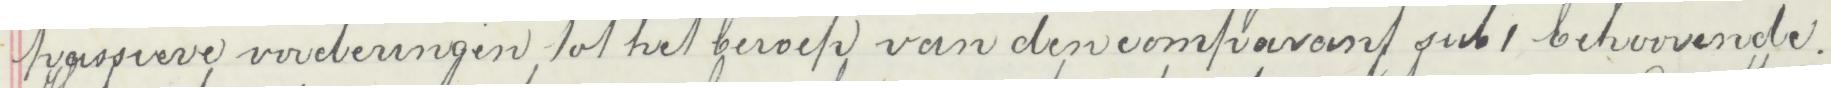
passieve vorderingen tot het beroep van den comparant sub 1 behoorende.
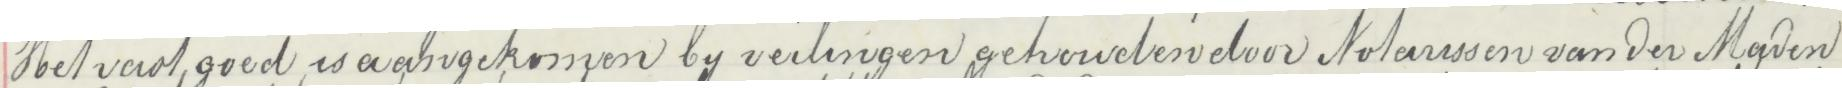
Het vast goed is aangekomen by veilingen gehouden door Notarissen van der Maden
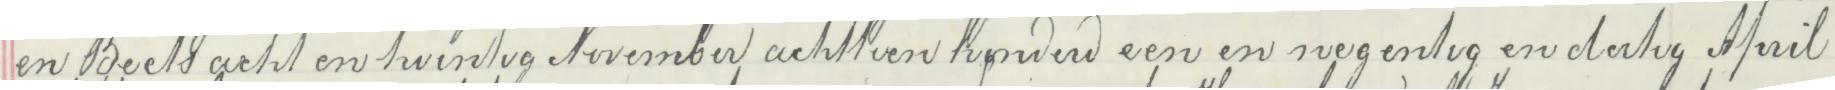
en Beets acht en twintig November achttien honderd een en negentig en dertig April
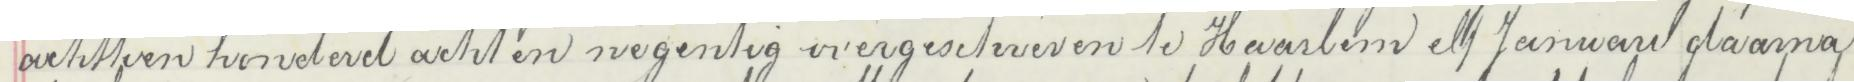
achttien honderd acht en negentig overgeschreven te Haarlem elf Januari daarna
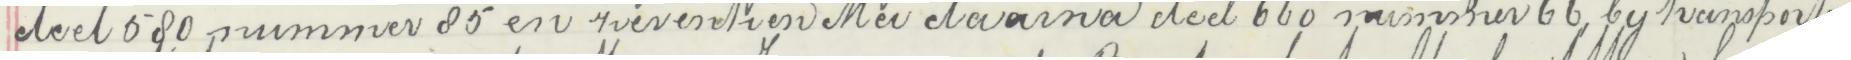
deel 680 nummer 85 en zeventien Mei daarna deel 660 nummer 66 by transporten
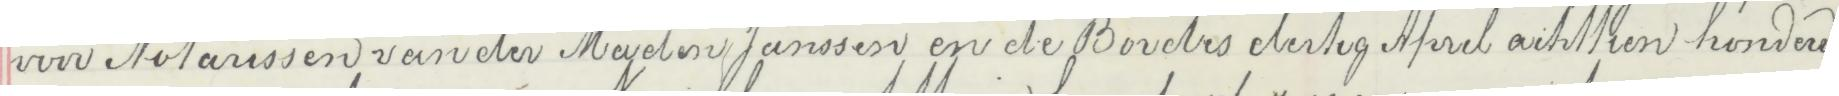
voor Notarissen van der Maden, Janssen en de Bordrs dertig April achttien honderd
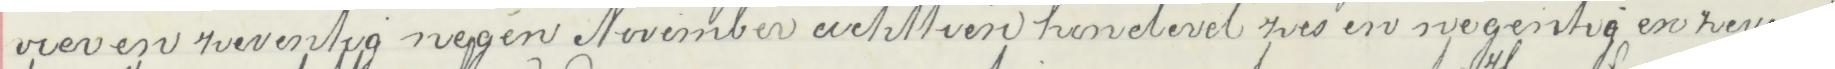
vier en zeventig negen November achttien honderd zes en negentig en zeven
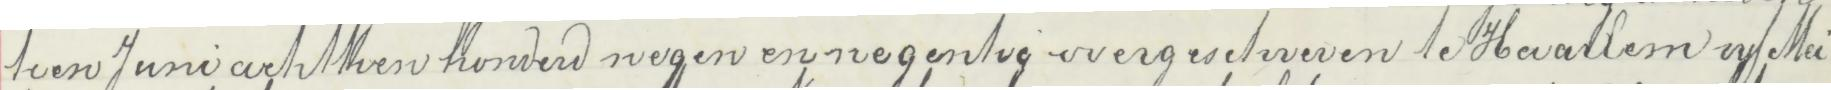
tien Juni achttien honderd negen en negentig overgeschreven te Haarlem vyf Mei
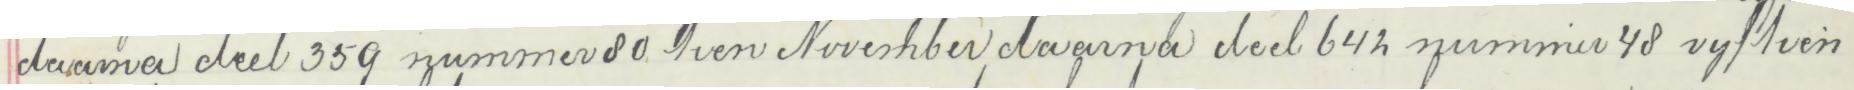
daarna deel 350 nummer 80 tien November daarna deel 642 nummer 48 vyftien
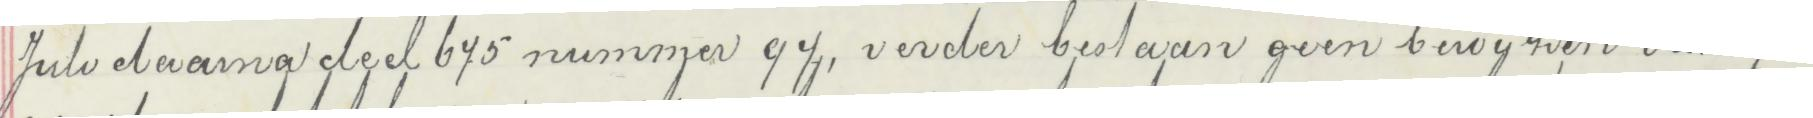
Juli daarna deel 675 nummer 97, verder bestaan geen bewyzen van ei
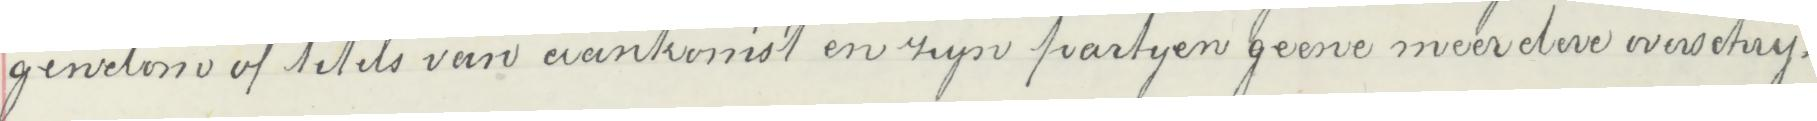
gendom of titels van aankomst en zyn partyen geene meerdere overschry„
